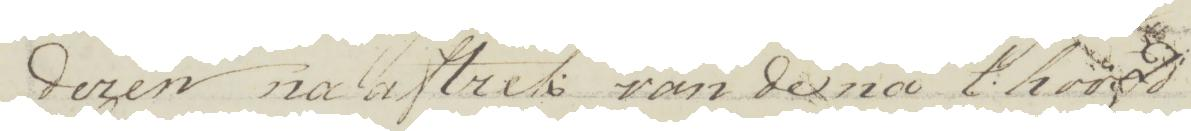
deren na aftrek van de na 't hoofd
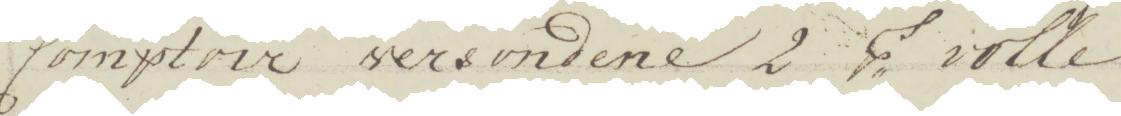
Comptoir versondene 2: p„s volle
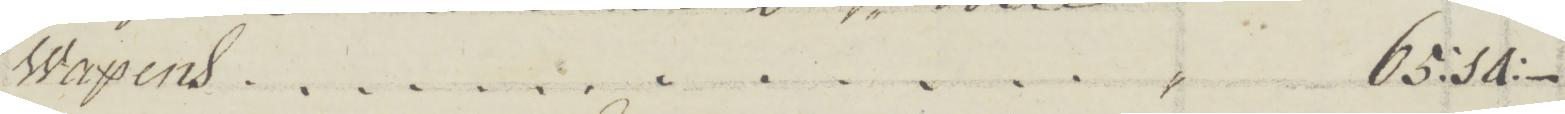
wapens . . . . . . . - . . . . . „ 65:14:—
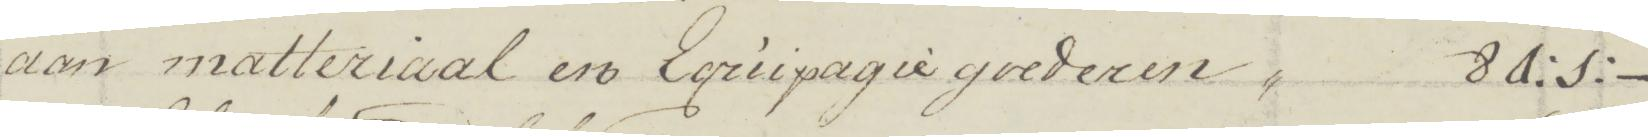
aan matteriaal en Equipagie goederen „ 84:1:—
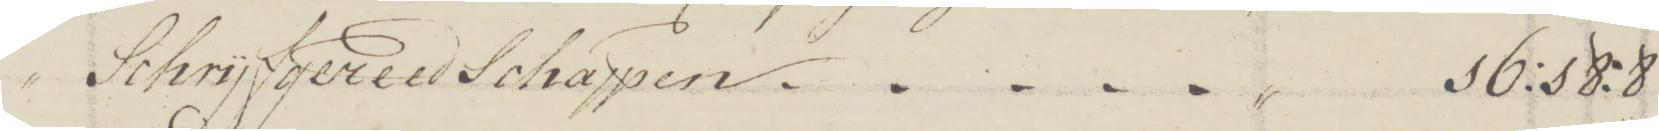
„ schrijfgereedschappen - - - - - „ 16:18:8
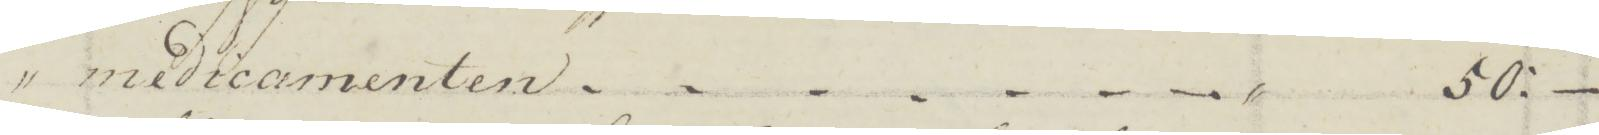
„ medicamenten - - - - - – – „ 50: —
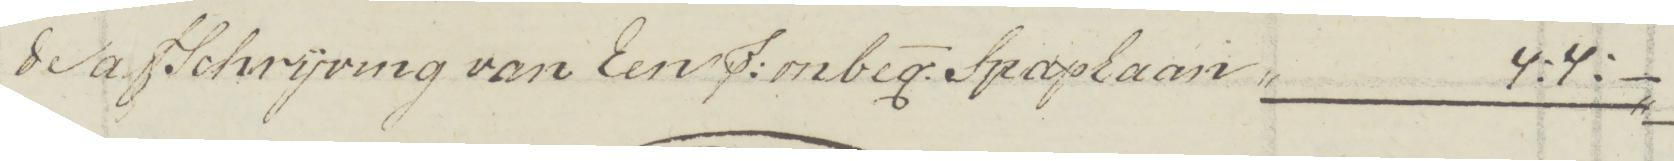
de afschrijving van Een p:s onbeq: spaphaan „ 7:7:—„
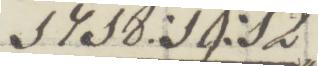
1718:19:12„
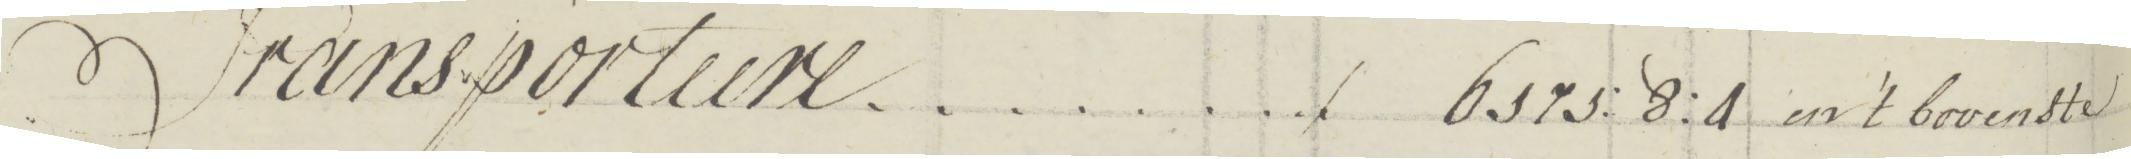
Transporteere . . . . . . . . ƒ 6175: 8:4 in ’t bovenste
